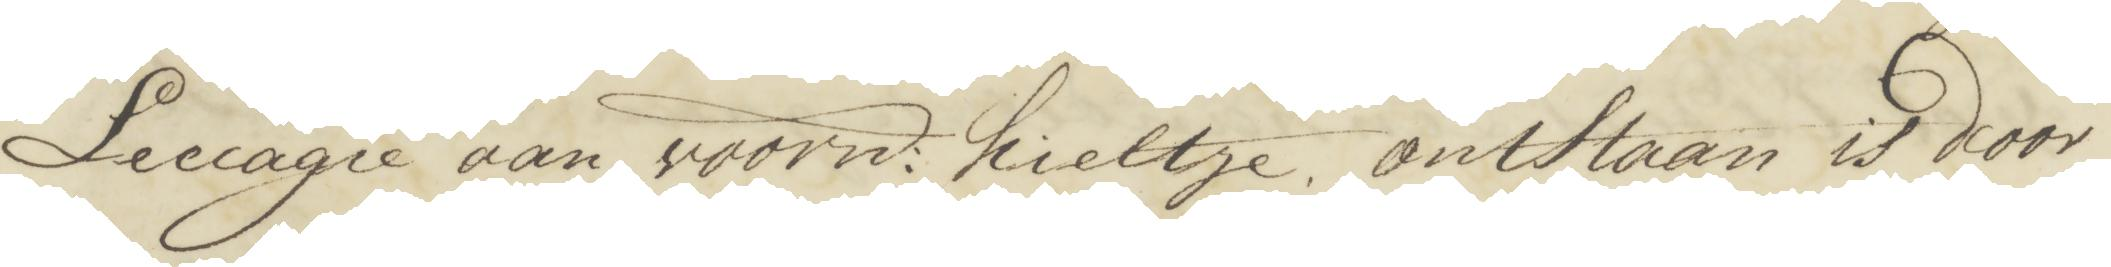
Leccagie aan voorn: kieltje, ontstaan is door
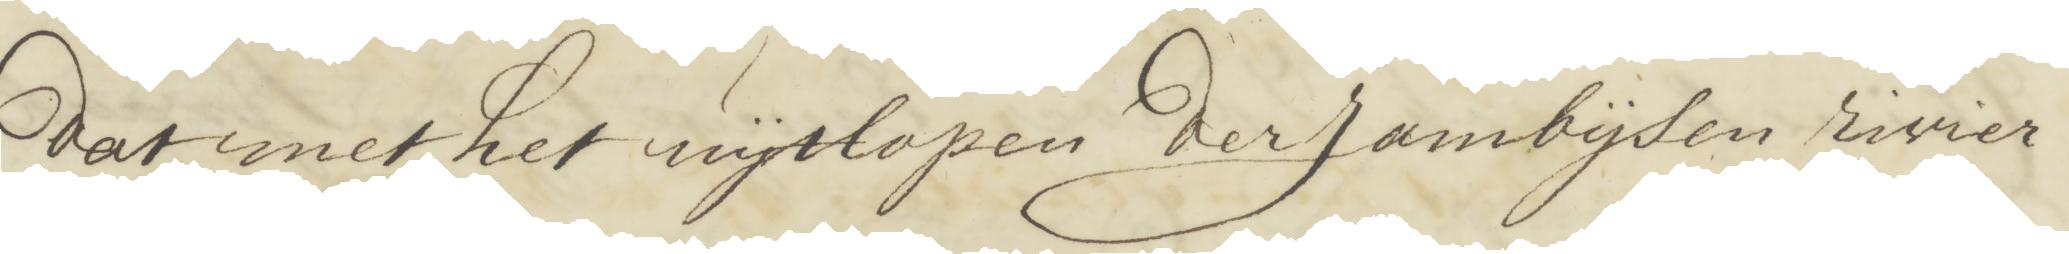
dat met het uijtlopen der Jambijsen rivier
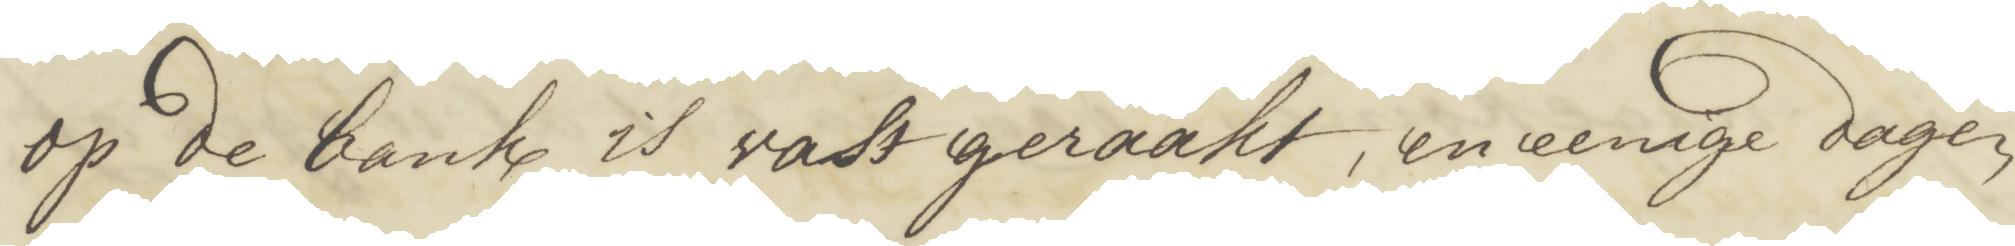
op de bank is vast geraakt, en eenige dagen
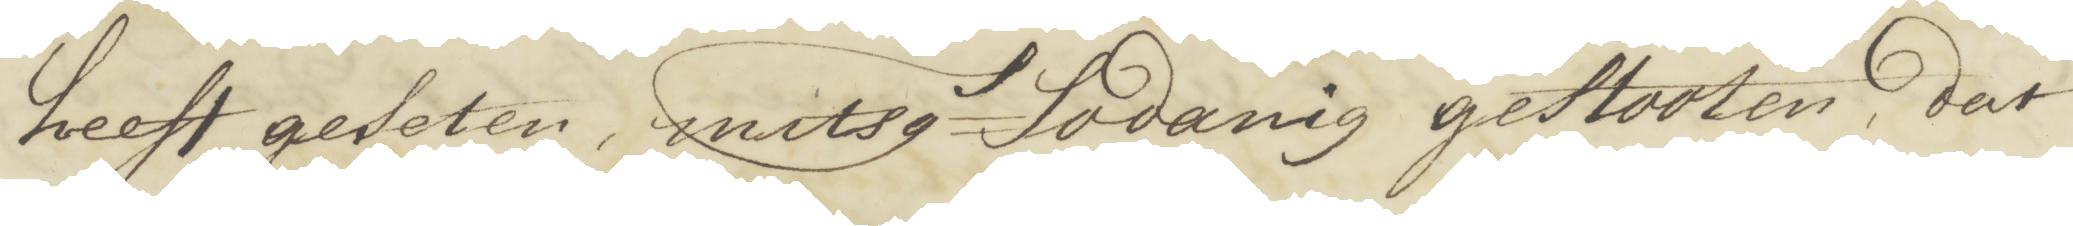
heeft geseten, mitsg=s sodanig gestooten, dat
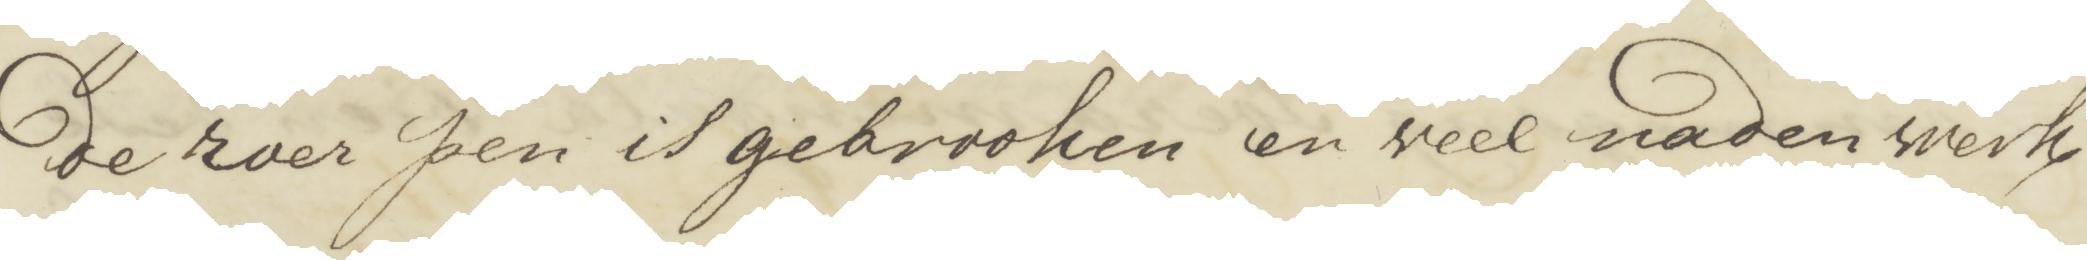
de roer pen is gebrooken en veel naden werk
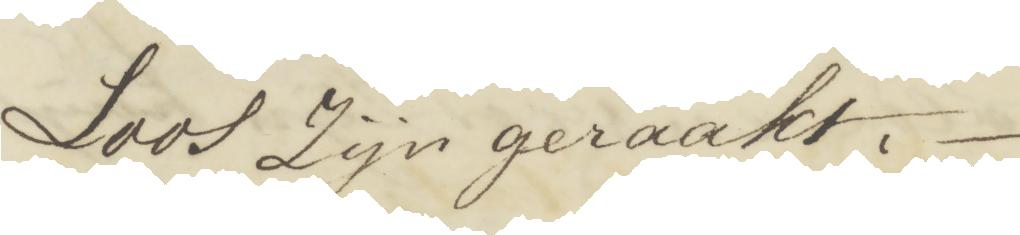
Loos zijn geraakt. —
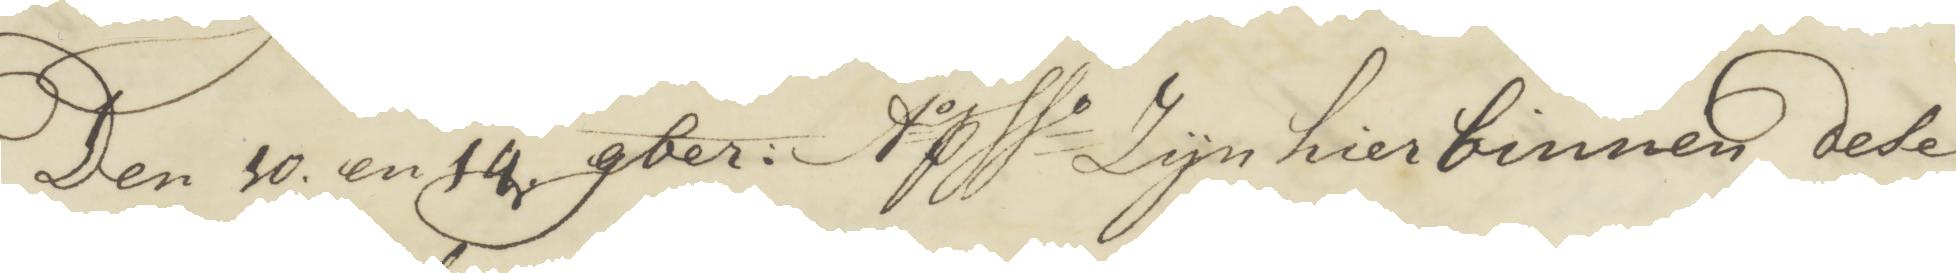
Den 10. en 14 9ber: A=o pss=o zijn hier binnen dese
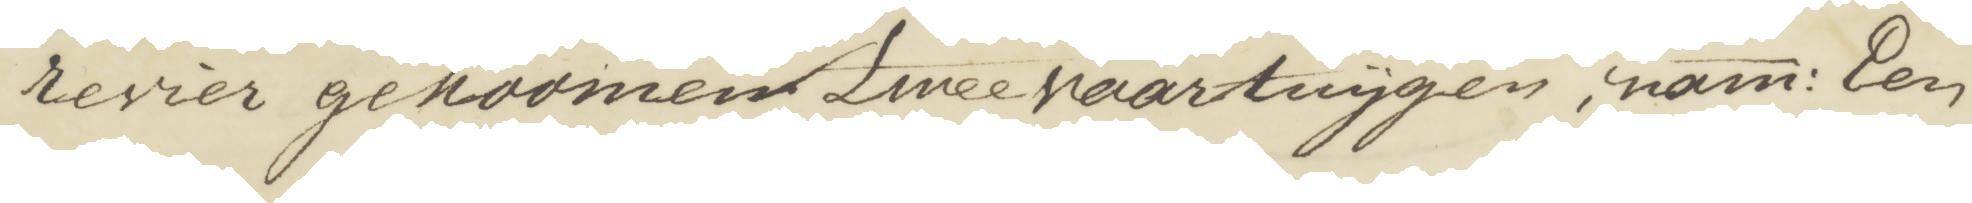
revier gekoomen twee vaartuijgen, nam: Een
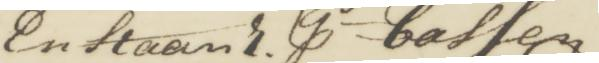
En Staan 7. p=s bassen
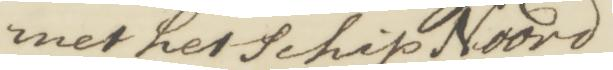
met het schip Noord
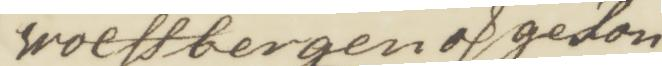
wolfsbergen over geson
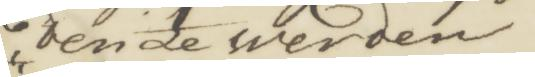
den te werden
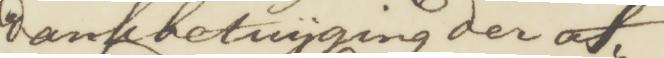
dankbetuijging der af„
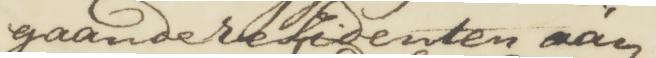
gaande residenten aan
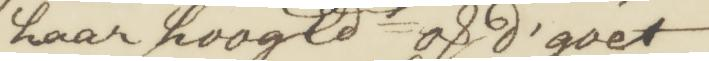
haar hoog Ed=s over d’ goet
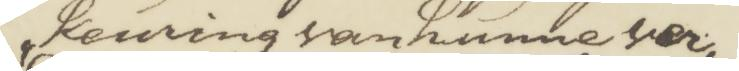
„keuring van hunne ver„
